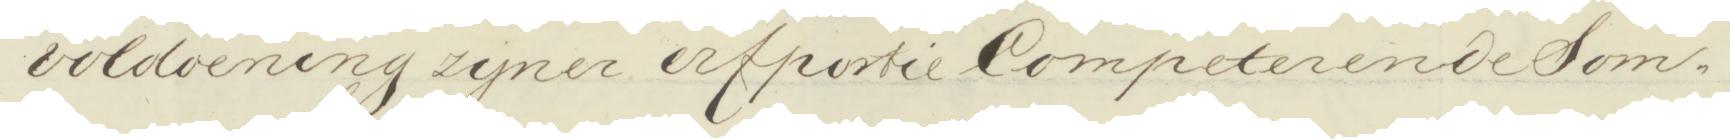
voldoening zyner erfportie Competerende Som„
